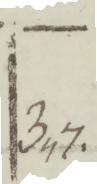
3„7.
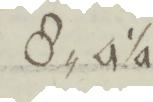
8„ 4¼
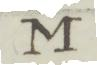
M
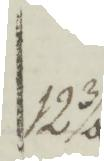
12¾
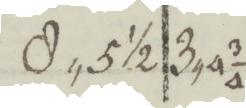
8„ 5½ 3„4¾
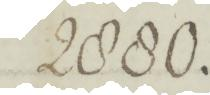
2880.
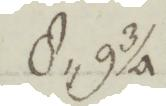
8„ 9¾
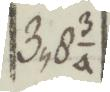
3„8¾
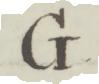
G
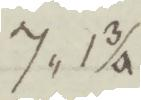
7„ 1¾
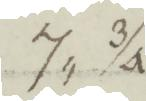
7„ ¾
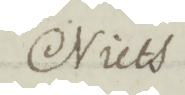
Niels
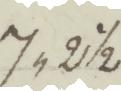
7„21½
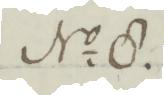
N-.o 8.
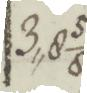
3„8 5/8
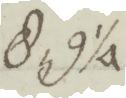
8„9¼
